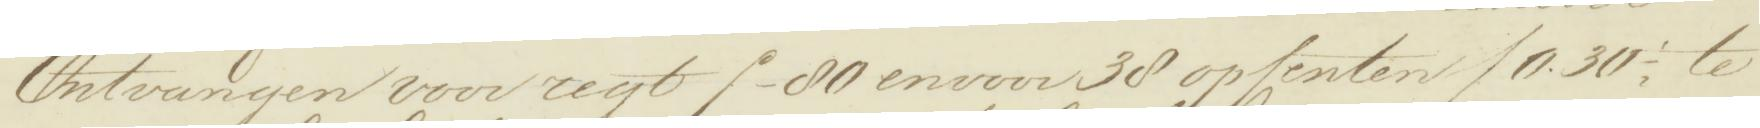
Ontvangen voor regt ƒ=80 en voor 38 op Centen ƒ0.30½ te
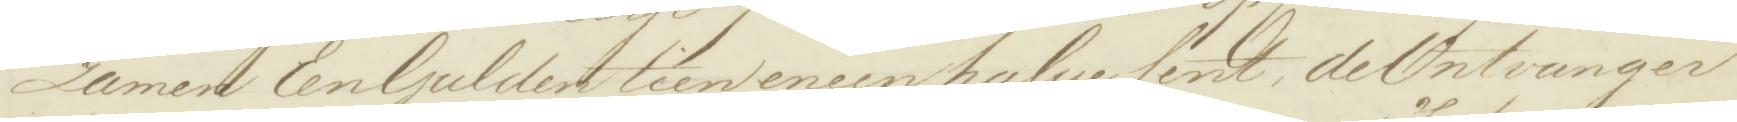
zamen Een Gulden tien en een halve Cent, de Ontvanger
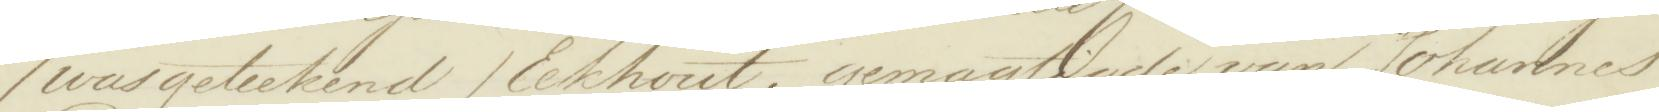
(was geteekend) Eekhout, gemagtigde van Johannes
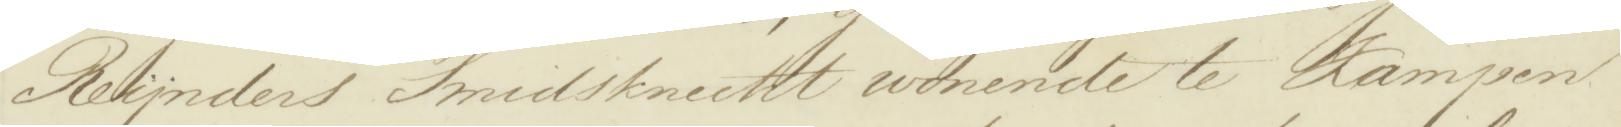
Reijnders Smidsknecht wonende te Kampen.
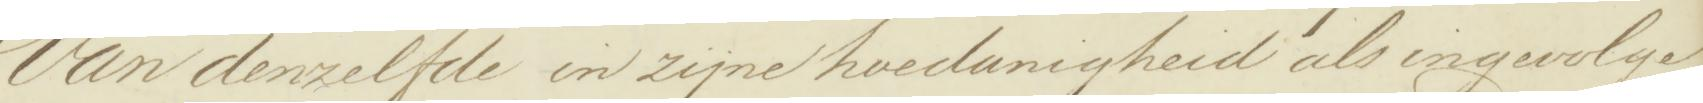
4.º Van denzelfde in zijne hoedanigheid als ingevolge
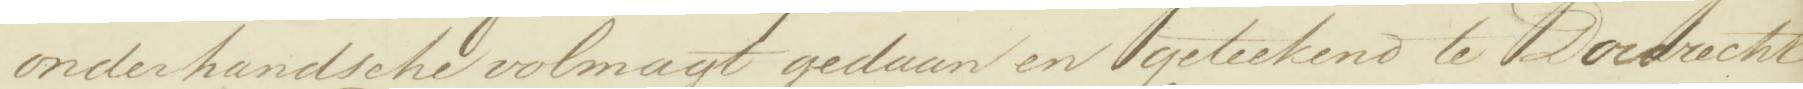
onderhandsche volmagt gedaan en geteekend te Dordrecht
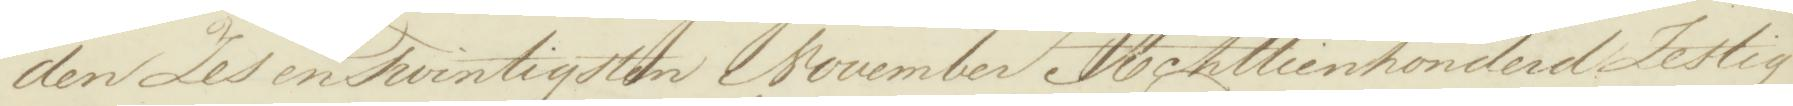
den Zes en Twintigsten November Achttienhonderd Zestig
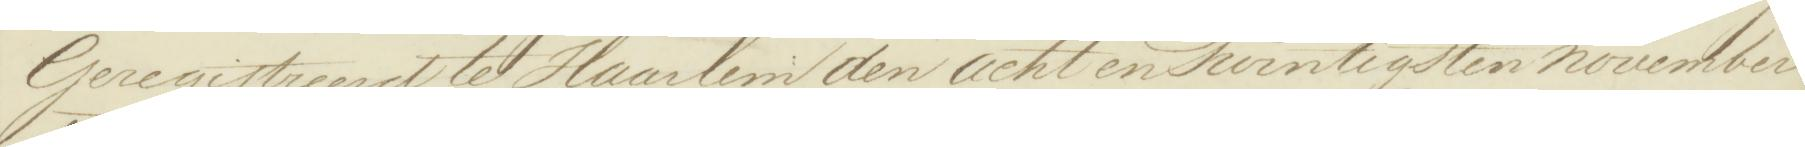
Geregistreerd te Haarlem den acht en Twintigsten november
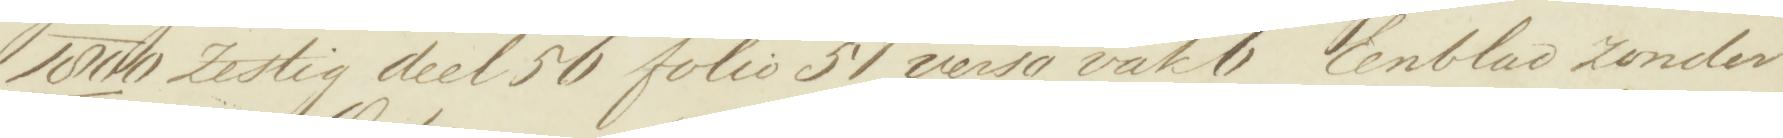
1800 zestig deel 56 folio 51 verso vak 6 Een blad zonder
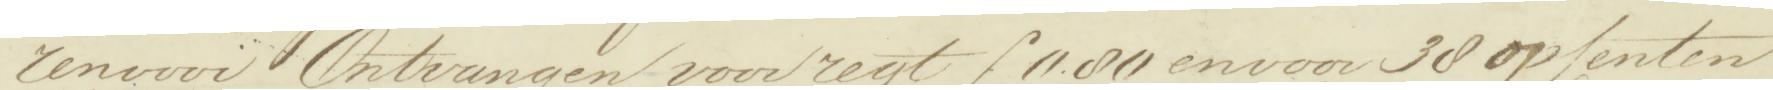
renvooi Ontvangen voor regt ƒ1.80 en voor 38 opCenten
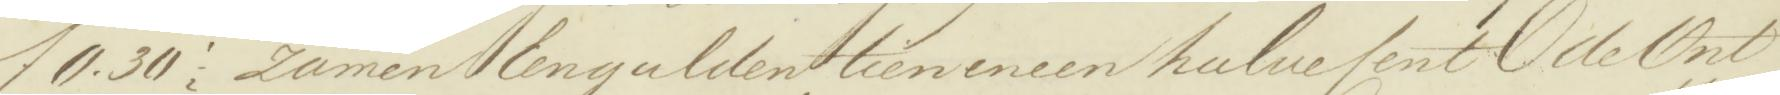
ƒ0.30½ zamen Een gulden tien en een halve Cent de Ont
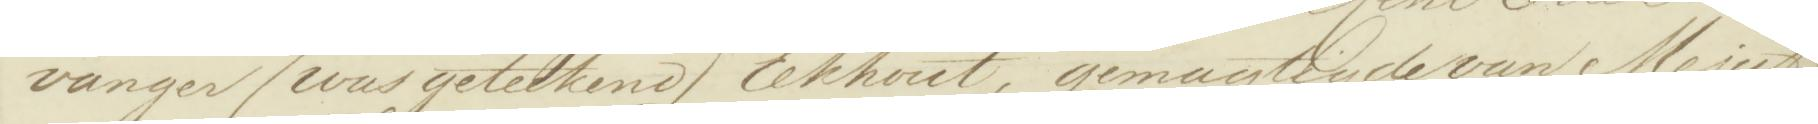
vanger (was geteekend) Eekhout, gemagtigde van Mejuf
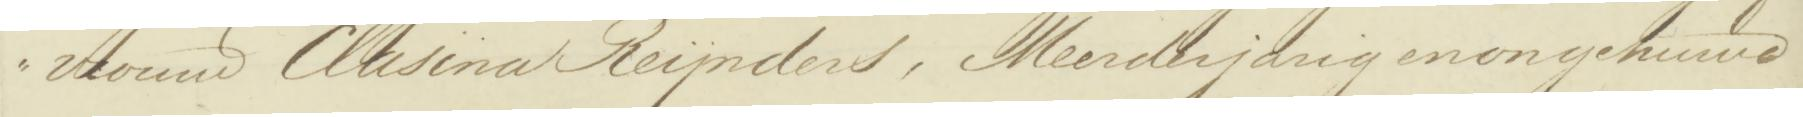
„vrouw Clasina Reijnders, Meerderjarig en ongehuwd
